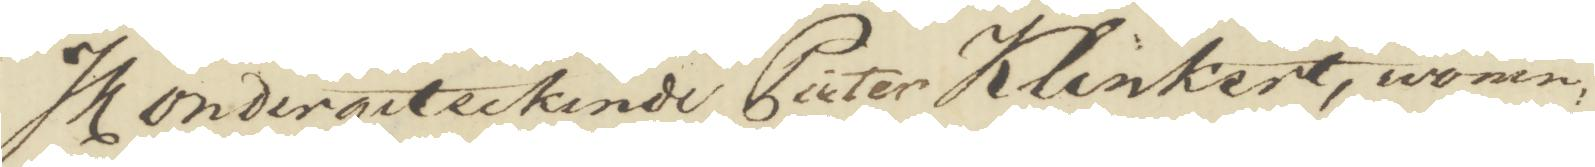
Jk ondergeteekende Pieter Klinkert, wonen:
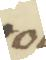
zwolle
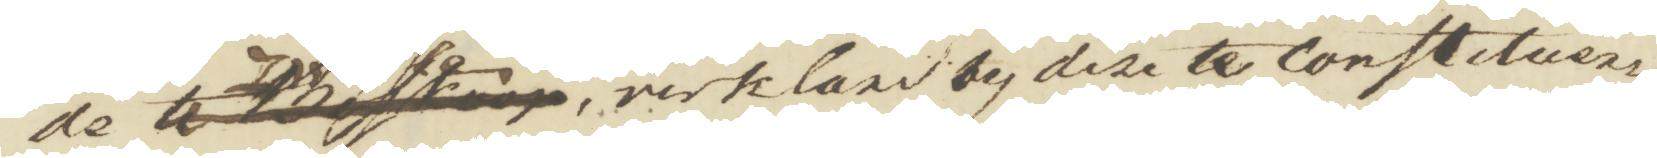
de te Boskoop, verklare by deze te constitueren
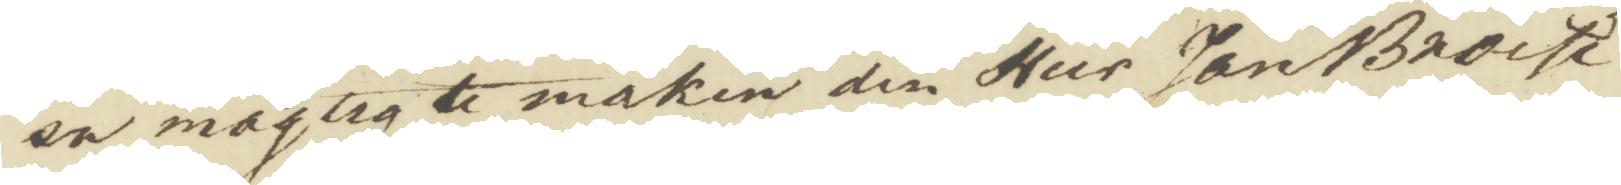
en magtig te maken den Heer Jan Broese
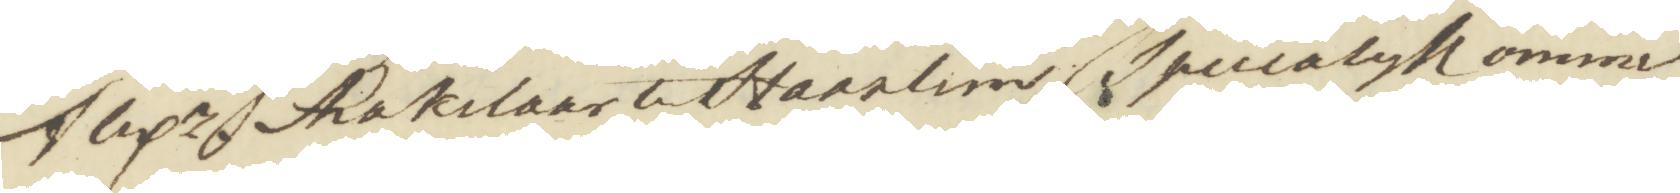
Alexz. Makelaar te Haarlem; specialyk omme
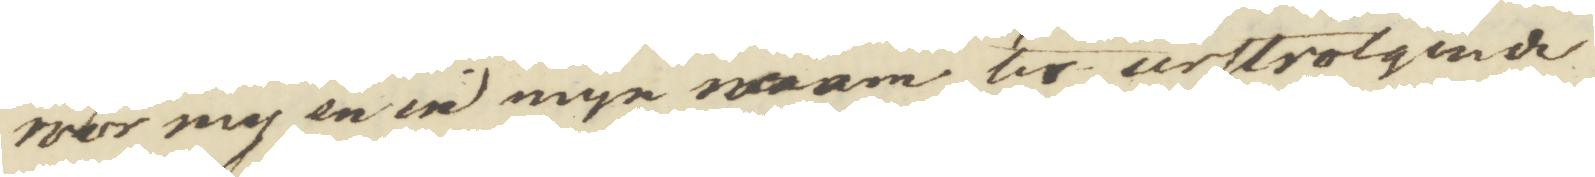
voor my en in myn naam ter eerstvolgende
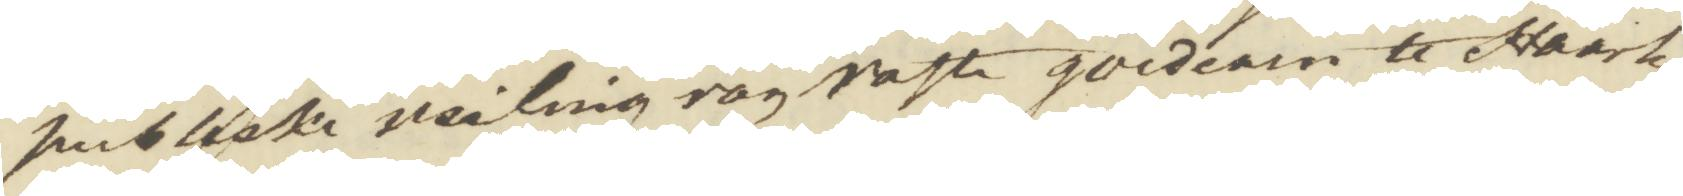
publieke veiling van vaste goederen te Haarlem
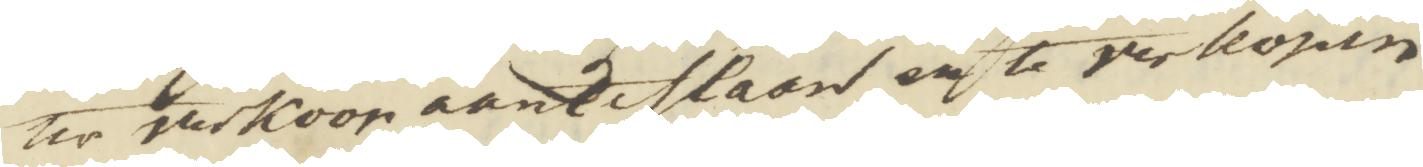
ter verkoop aan de slaan en te verkopen
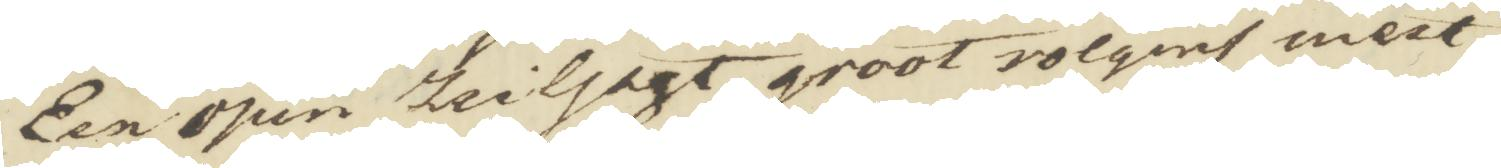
Een open zeiljagt, groot volgens meet
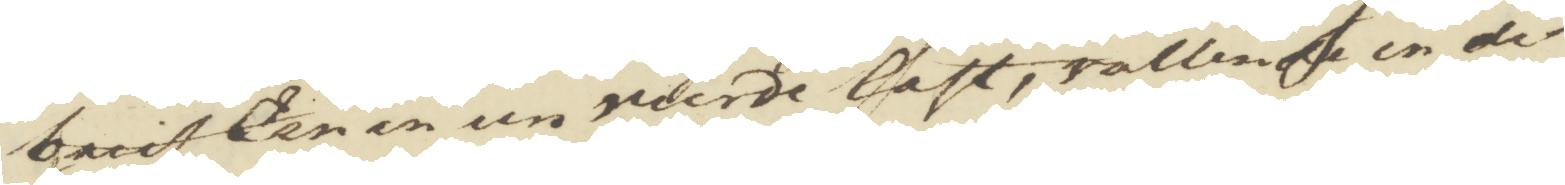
brief Een en een vierde last, vallende in de
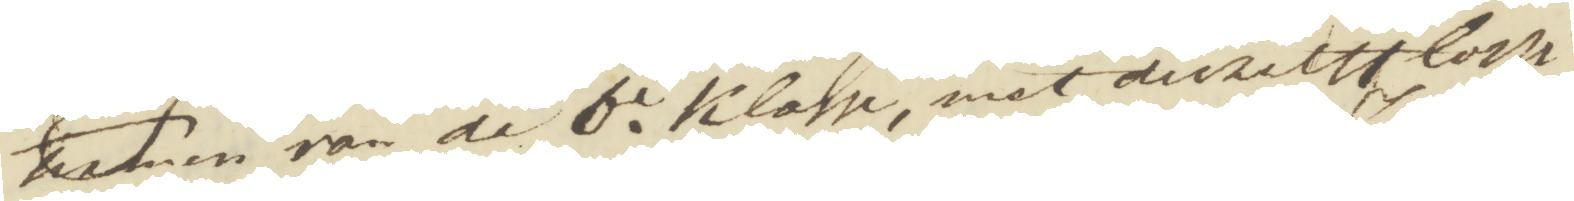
Termen van de 6.e Klasse, met deszelfs losp
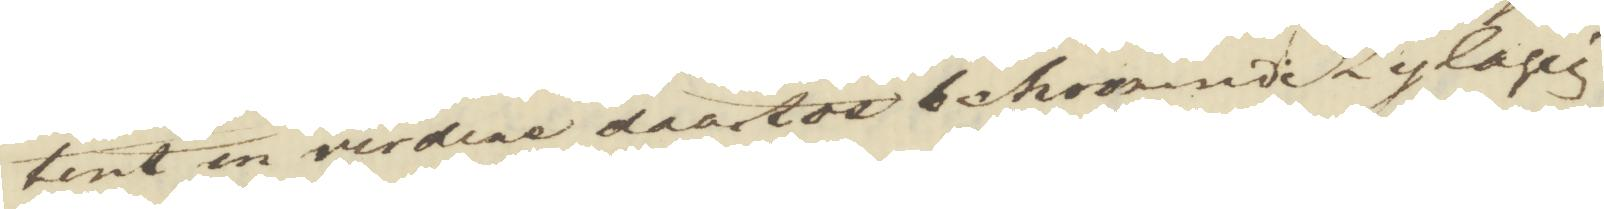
tent in verdere daar toe behoorende zulagen
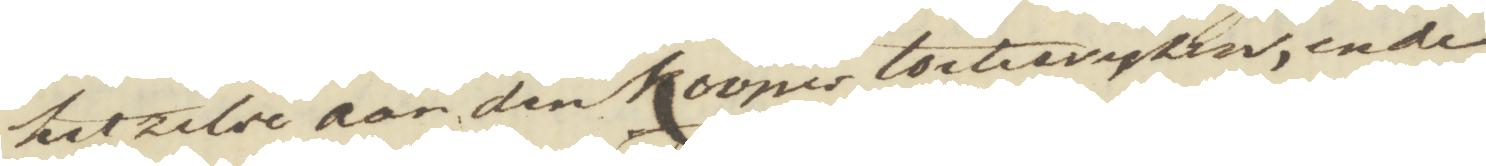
hetzelve aan den Kooper toetewyzen, en de
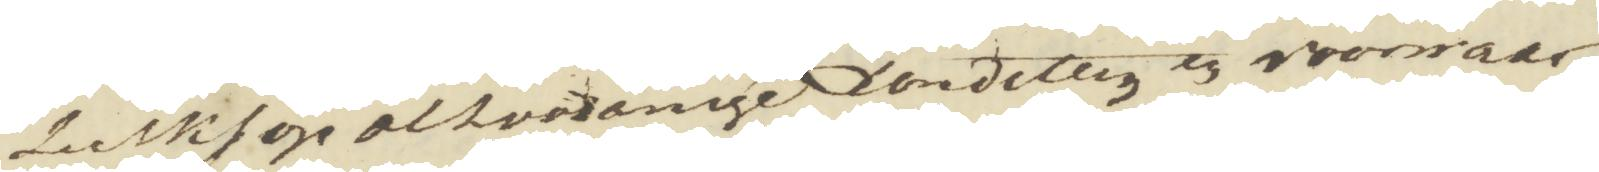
zulks op alzoodanige conditien en voorwaar
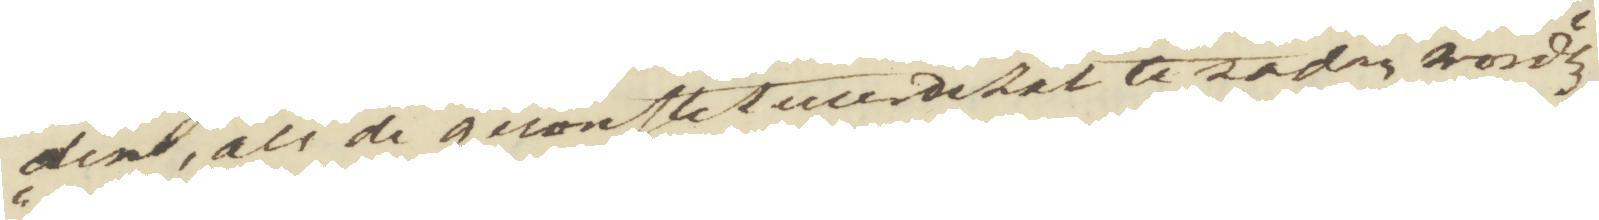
den, als de geconstitueerde zal te raden worden
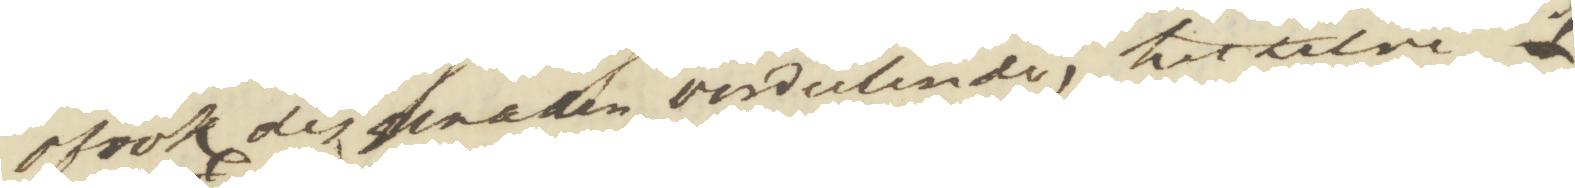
of ook des siraden verdeelende, hetzelve t
